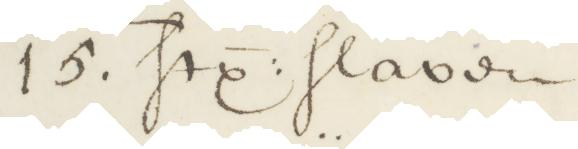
15. stx: slaven
